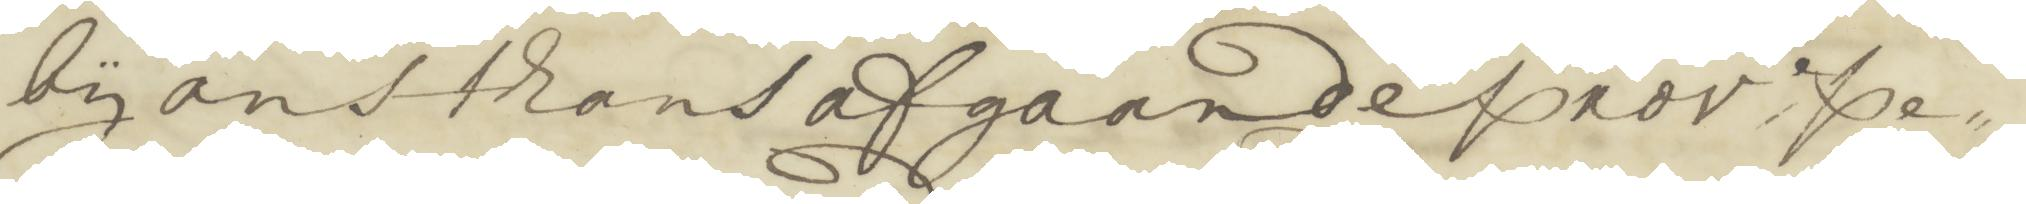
bij ons thans afgaande prov,e pe„
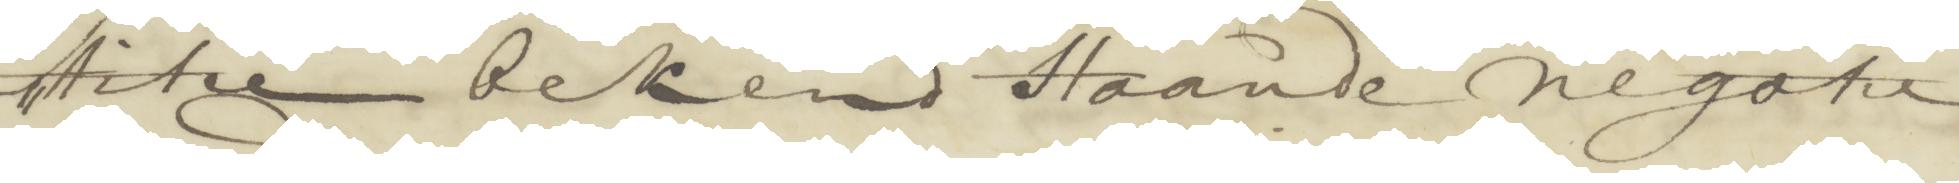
„titie bekend staande negotie
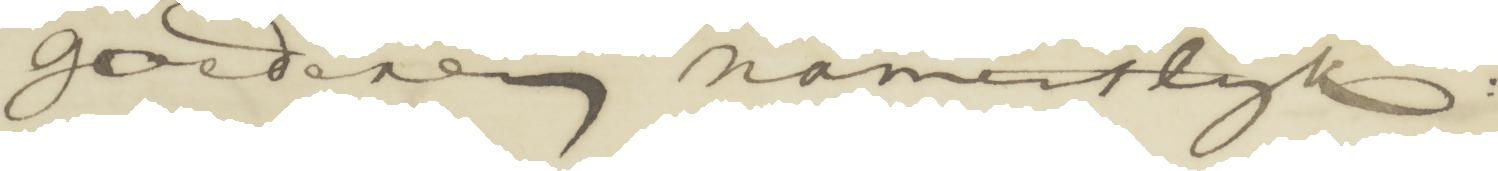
goederen namentlijk
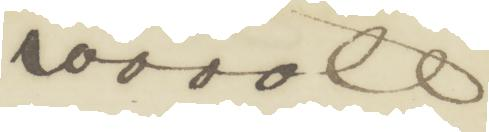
10'000 lb
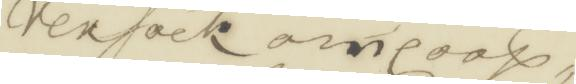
versoek om Coop„
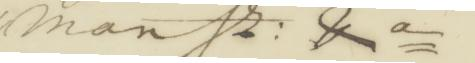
„mansz: &=a
